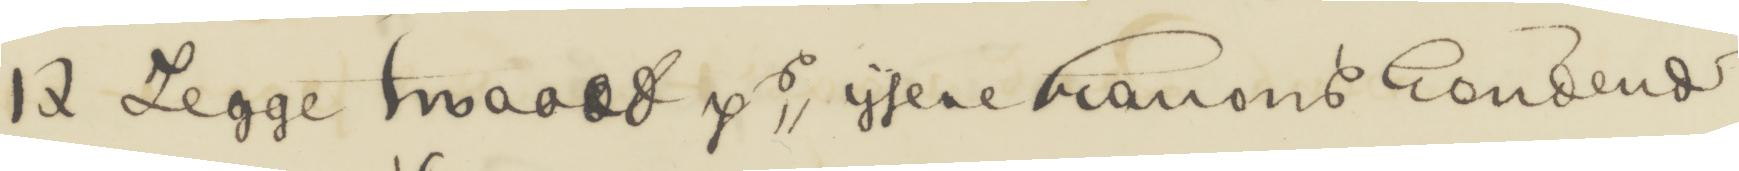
12 zegge twaalf p„s ijsere kanons houdende
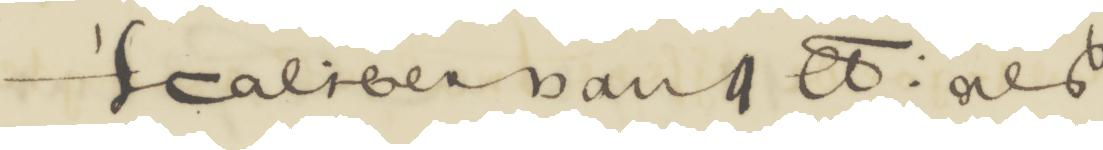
'tcaliber van 4 lb: als
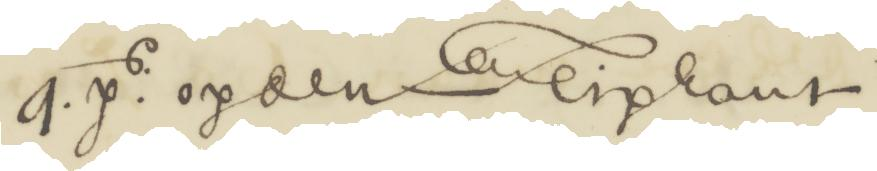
4. p:s op den Eliphant
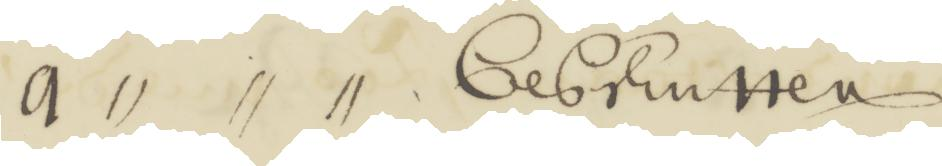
4 „ „ „ beschutter
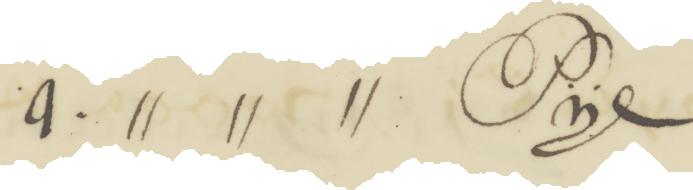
4. „ „ „: Pijl
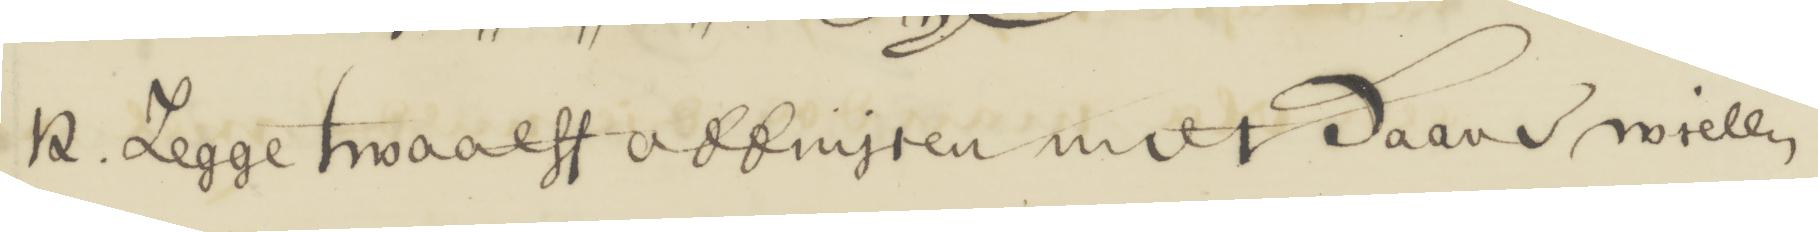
12. zegge twaalff affuijten met haare wielen
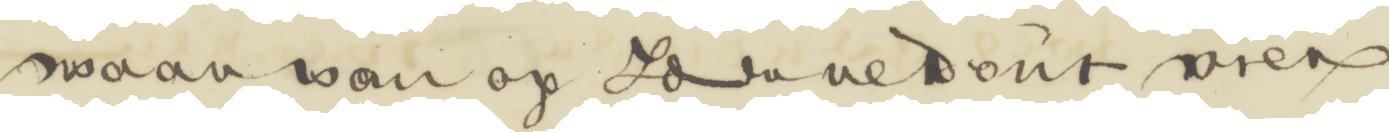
waar van op Ider redout vier
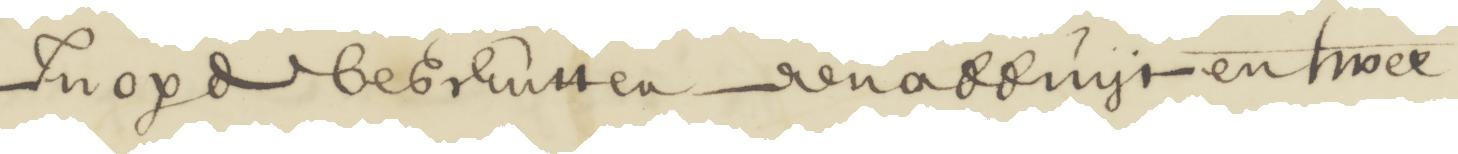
En op de beschutter een affuijt en twee
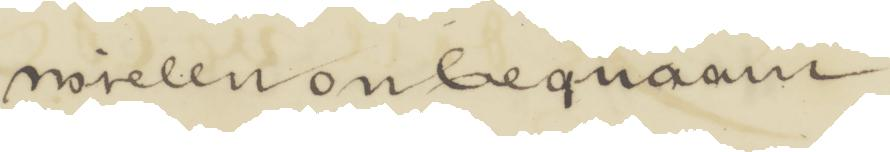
wielen onbequaam
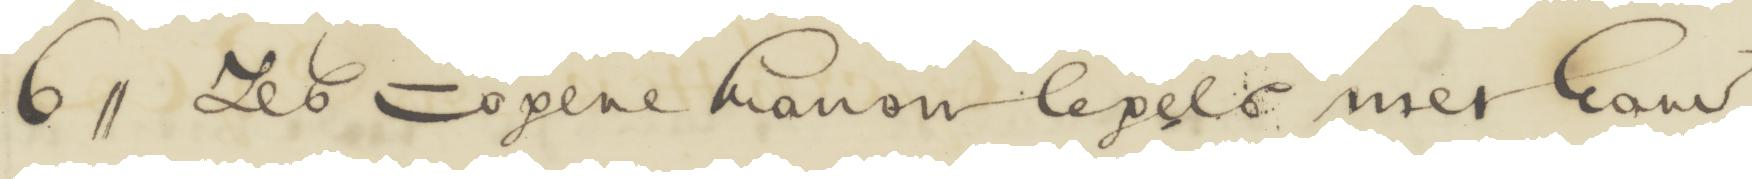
6 „ zes copere kanon lepels met hare
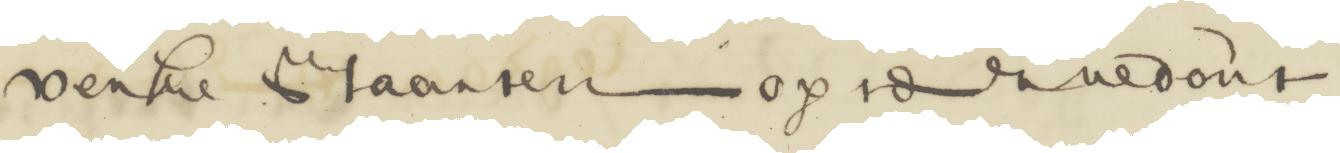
verke staarten op ider redout
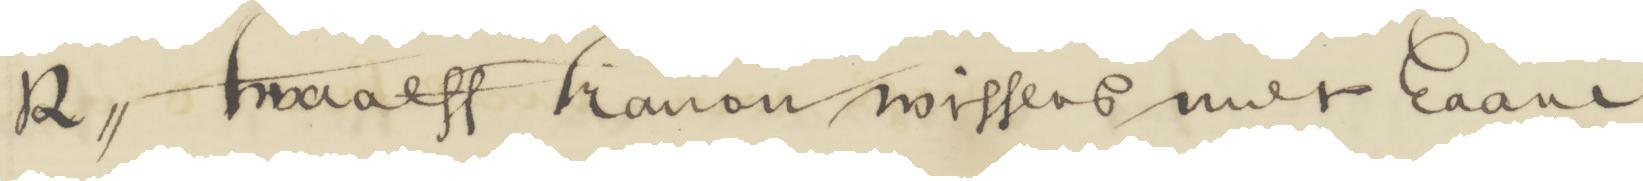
12 „ twaalff kanon wissers met haare
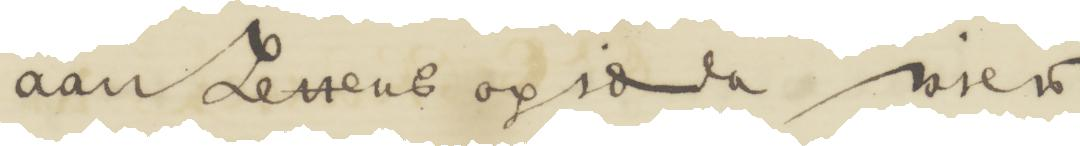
aanzetters op ider vier
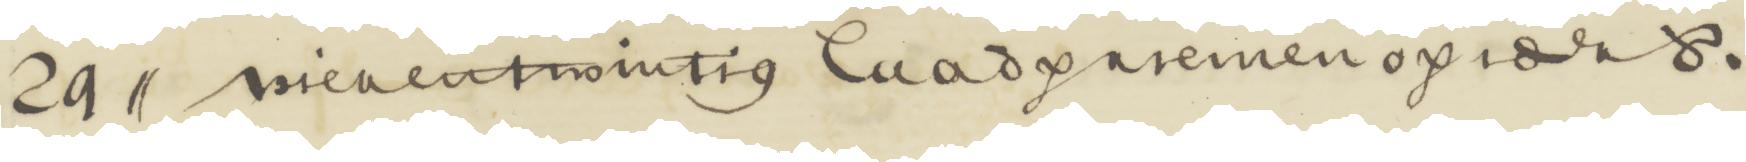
24 „ vierentwintig laadpriemen op ider 8.
